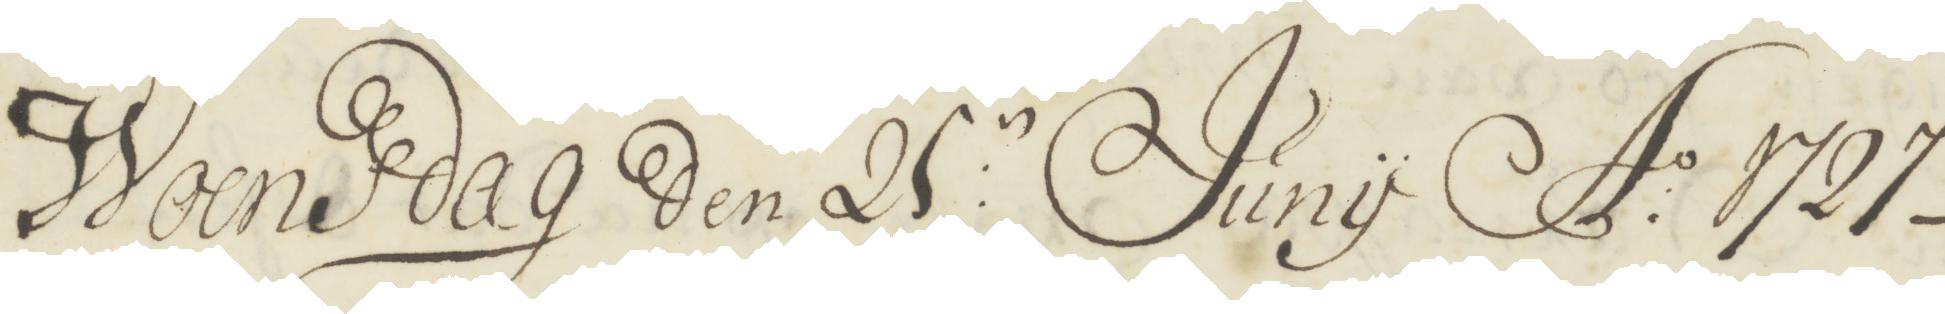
Woensdag den 25:e Iunij A:o 1727-
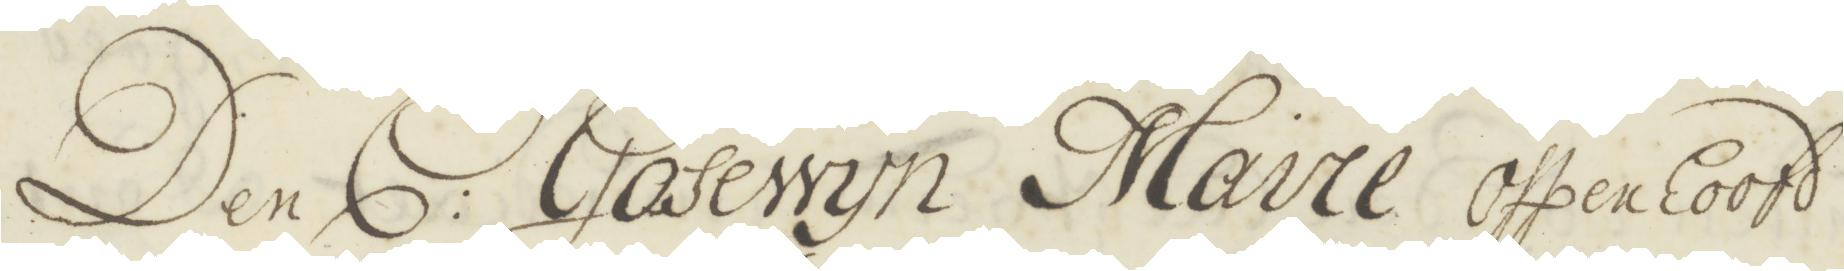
Den E: Gosewyn Maire opperhoofd
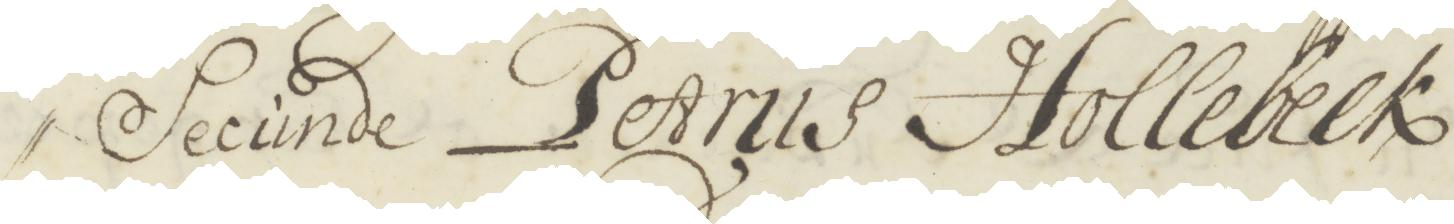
„ Secunde Petrus Hollebeek
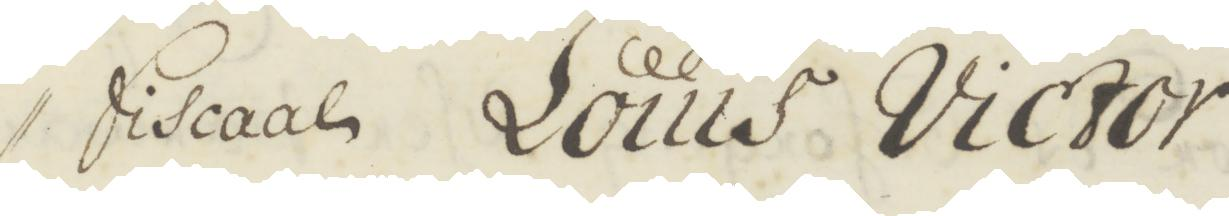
„ fiscaal Louis Victor
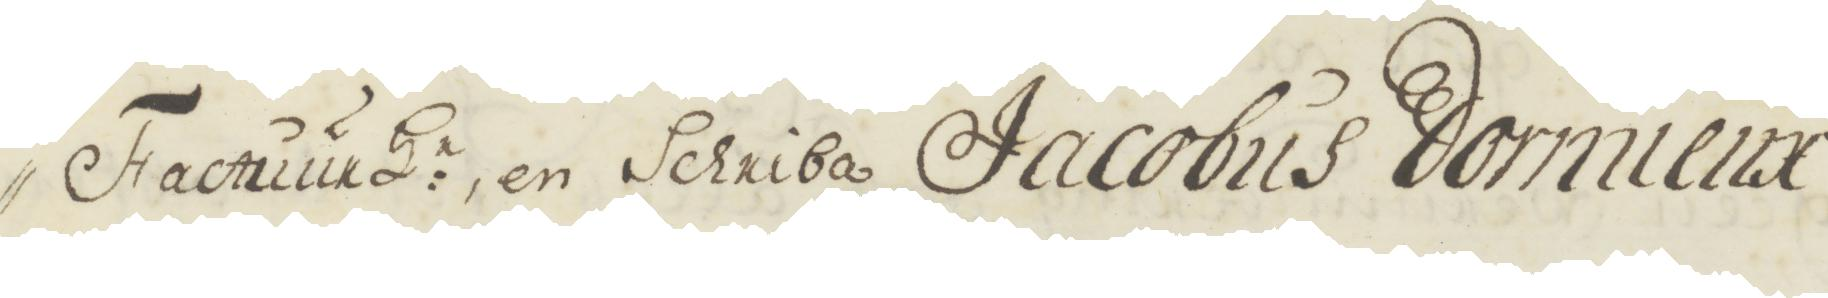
„ Factuur h:r, en Schriba Iacobus Dormieux
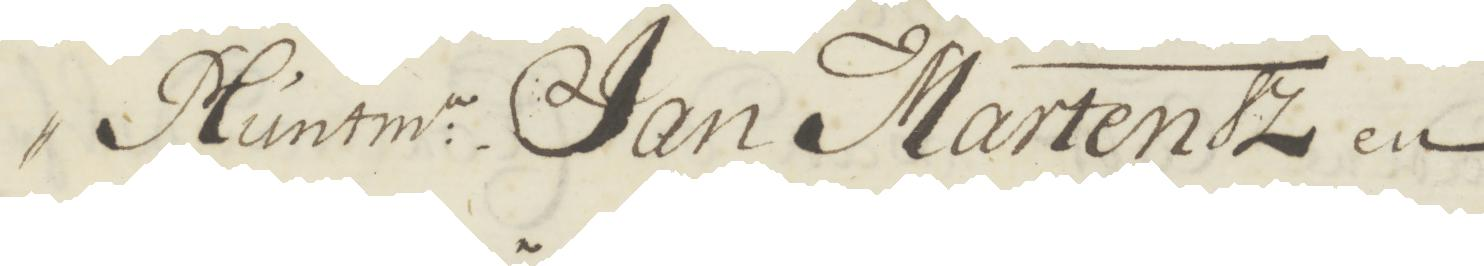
„ Muntm:r Jan Martensz en
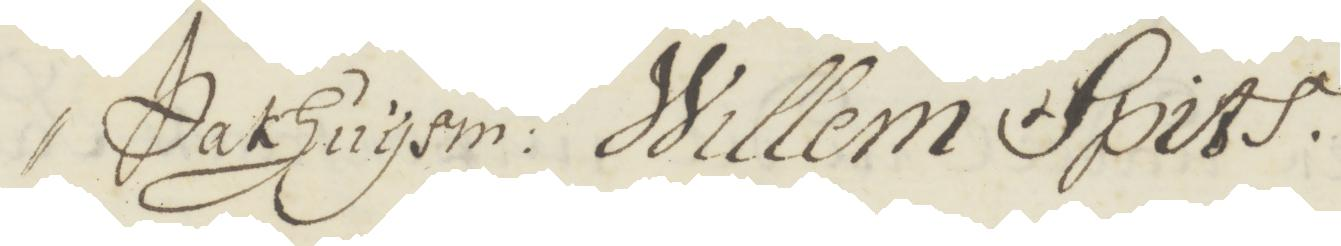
„ Pakhuijsm:r Willem Spits.
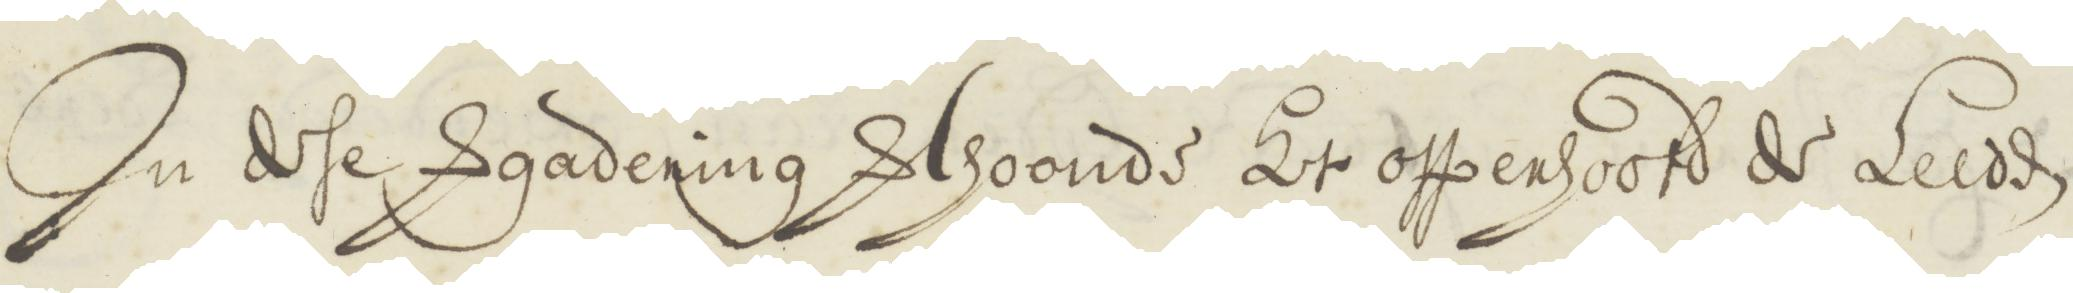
Jn dese vergadering verthoonde het opperhoofd de Leeden
